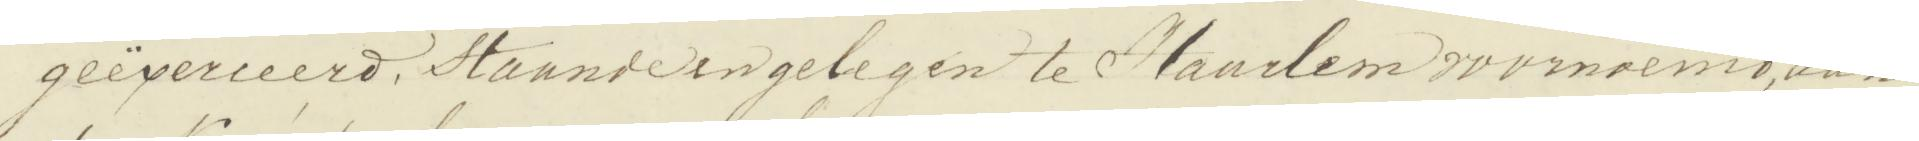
geëxerceerd, staande en gelegen te Haarlem voornoemd, aan
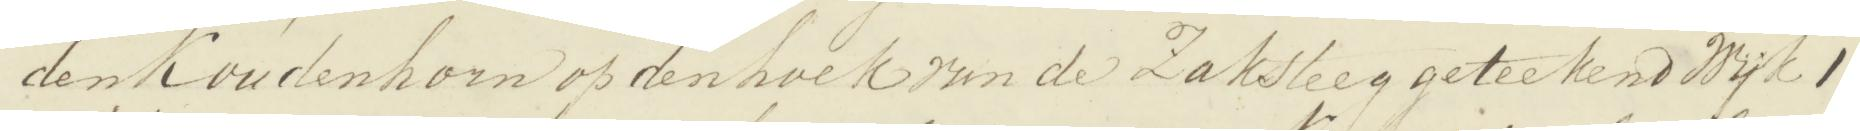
den Koudenhorn op den hoek van de Zaksteeg geteekend Wijk1
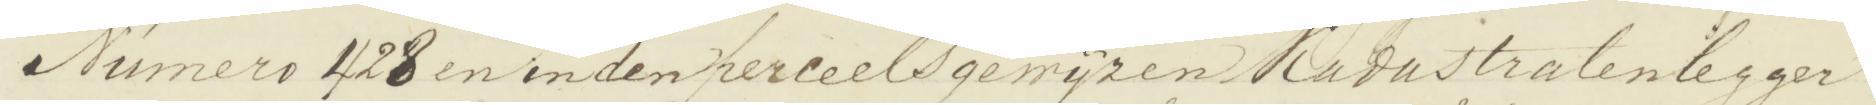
Numero 428 en in den perceels gewijzen Kadastralenlegger
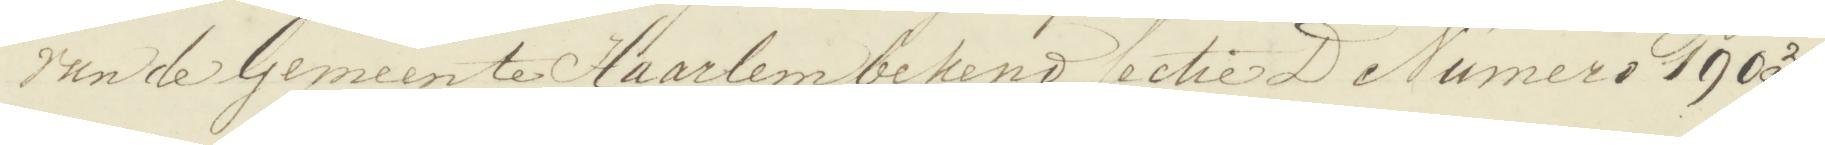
van de Gemeente Haarlem bekend sectie D Numero 1903
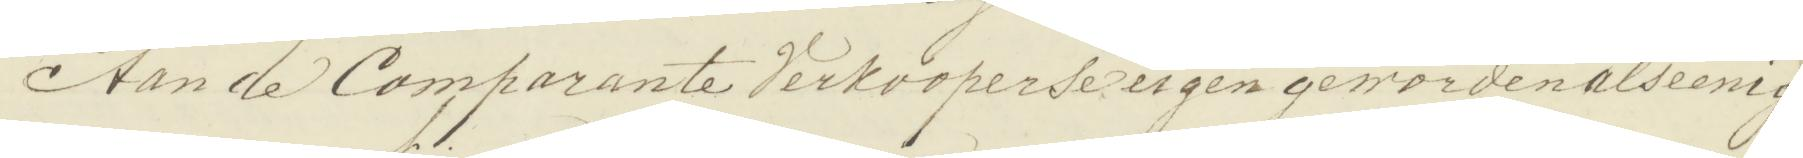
Aan de Comparante Verkooperse eigen geworden als eenig
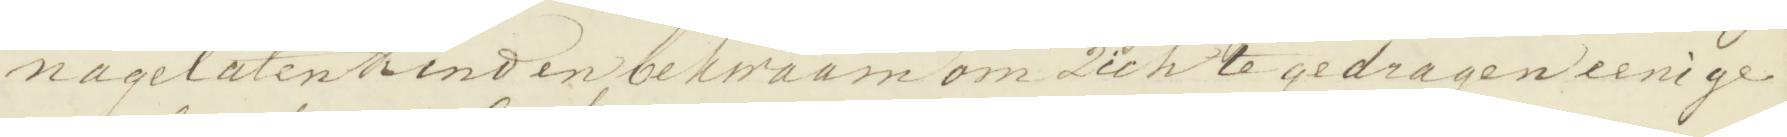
nagelaten kind en bekwaam om zich te gedragen eenige
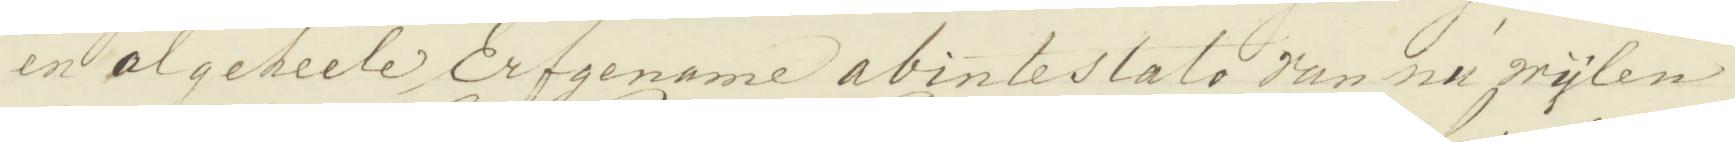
en algeheele Erfgename abintestato van nu wijlen
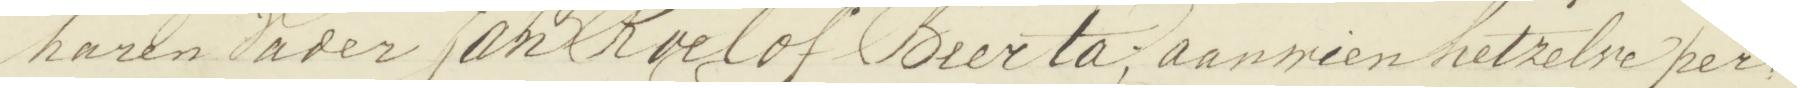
haren Vader Jan Roelof Beerta; aanwien hetzelve per„
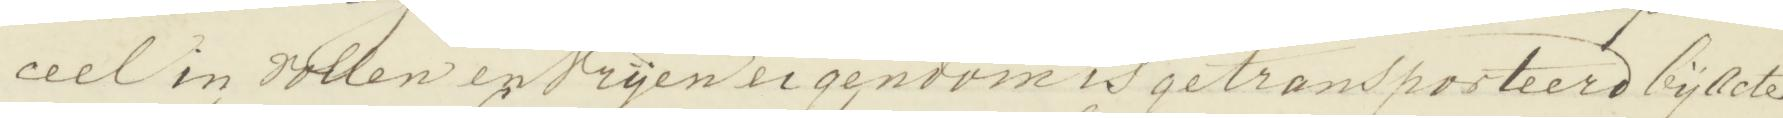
ceel in vollen en Vrijen eigendom is getransposteerd bij Acte
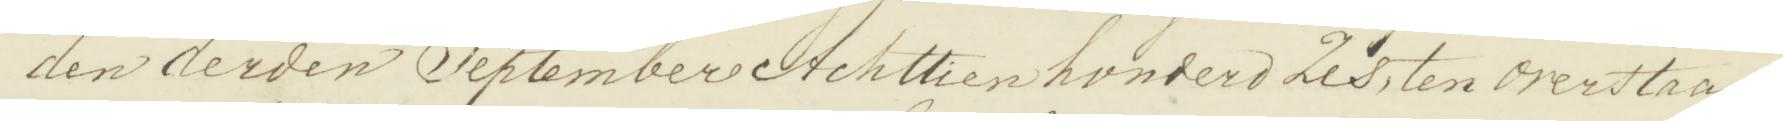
den derden September Achttien honderd Zes, ten overstaan
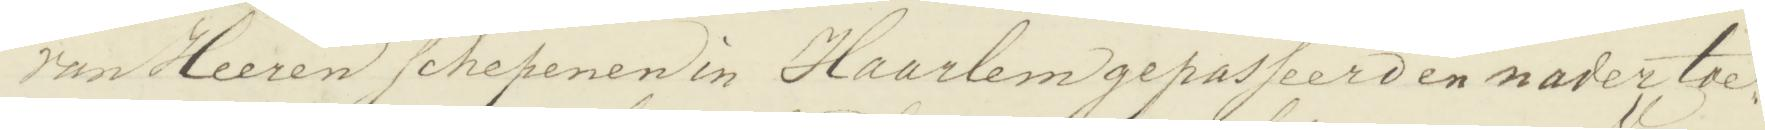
van Heeren schepenen in Haarlem gepasseerd en nader, toe
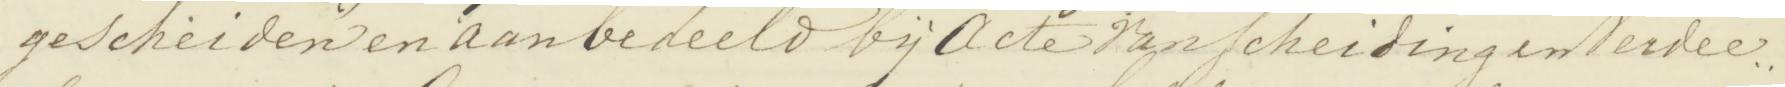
gescheiden en aanbedeeld bij Acte van scheiding en Verdee„
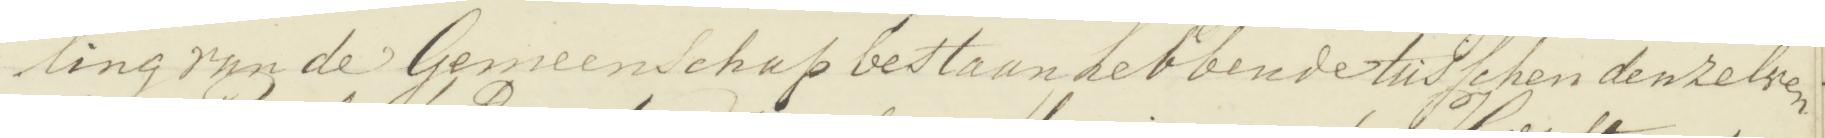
ling van de Gemeenschap bestaan hebbende tusschen denzelven
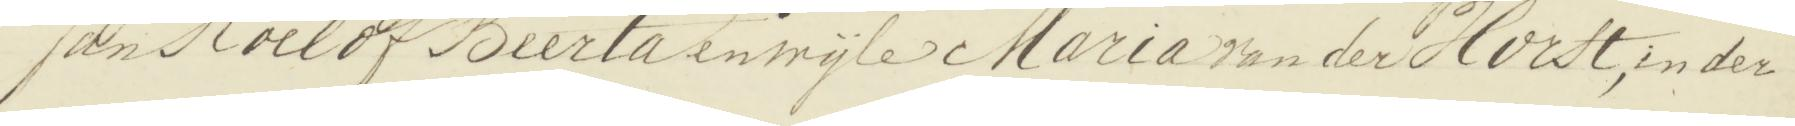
Jan Roelof Beerta enwijle Maria van der Horst, in der
